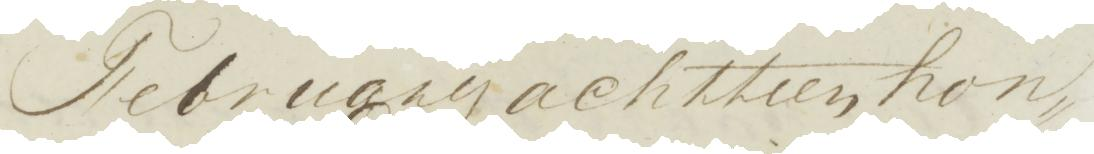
February achttien hon„
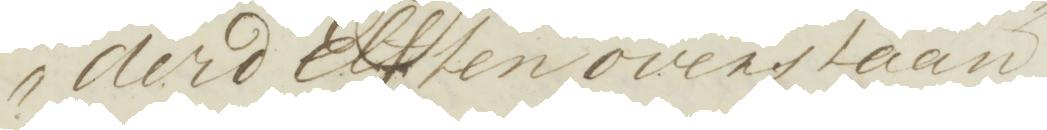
„derd Elf ten overstaan
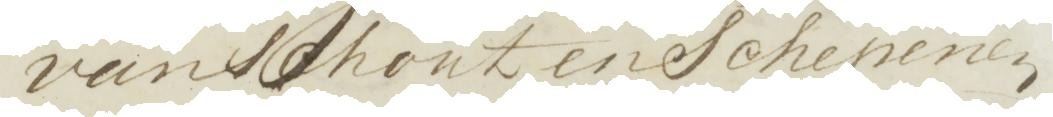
van schout en Schepenen
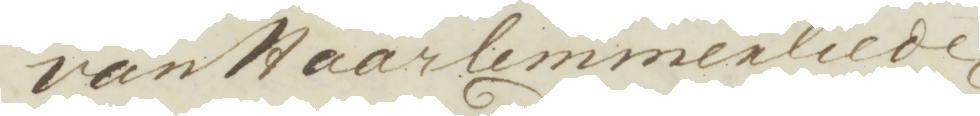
van Haarlemmerliede,
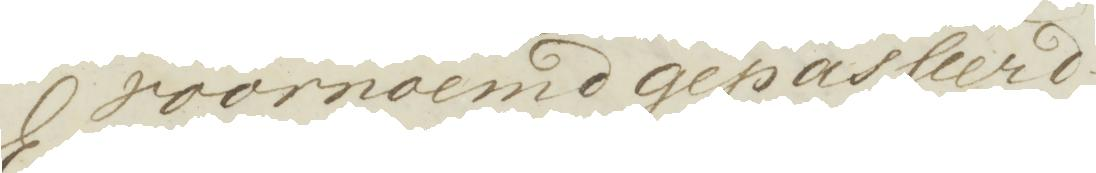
voornoemd gepasseerd
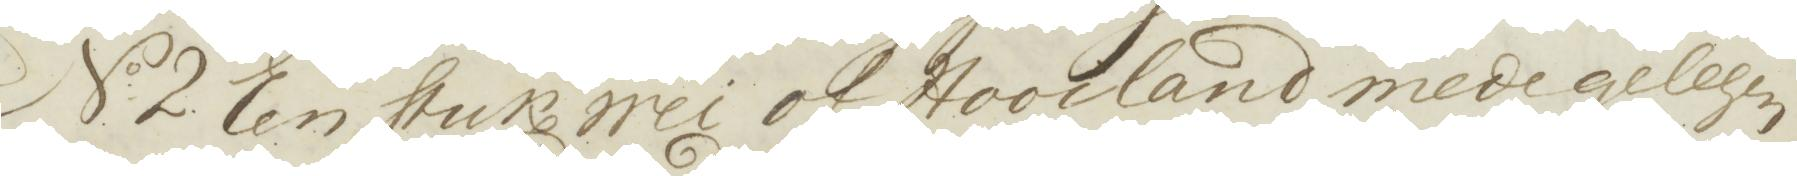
N:o 2. Een stuk wei of Hooiland mede gelegen
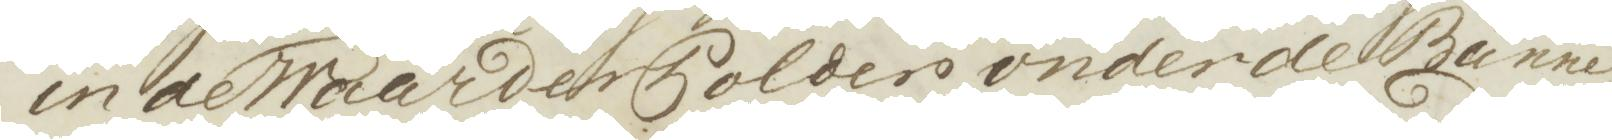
in de Waarder Polder onder de Banne
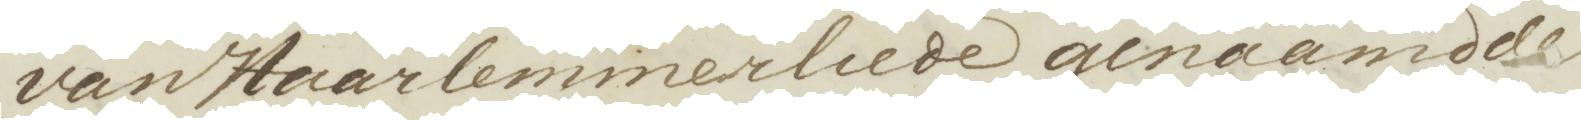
van Haarlemmerliede genaamd de
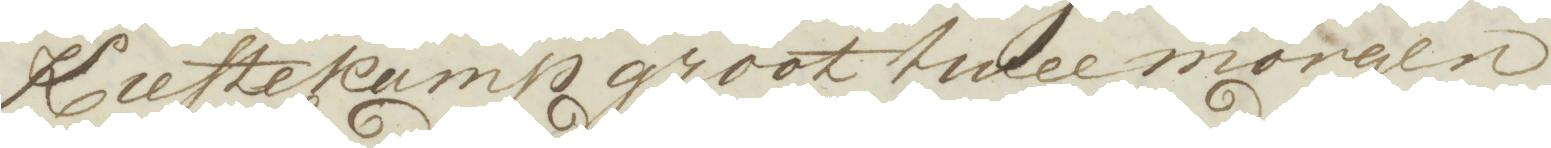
Kiestekamp groot twee morgen
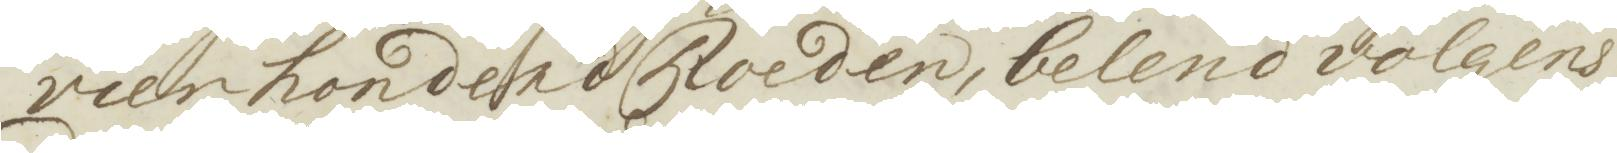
vier honderd Roeden, belend volgens
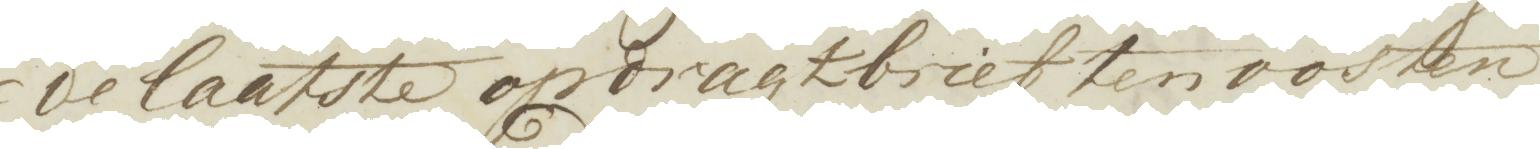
de laatste opdragtbrief ten oosten
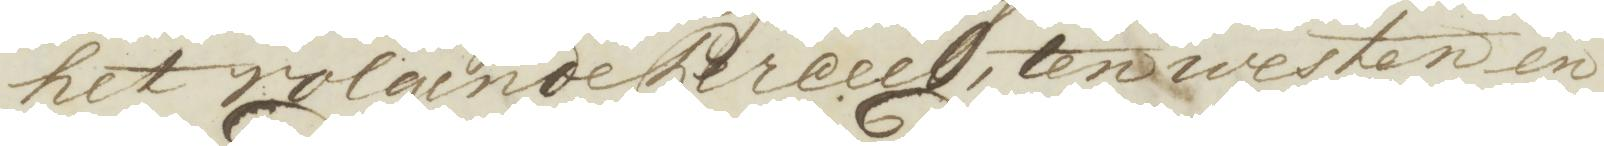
het volgende Perceel, ten westen en
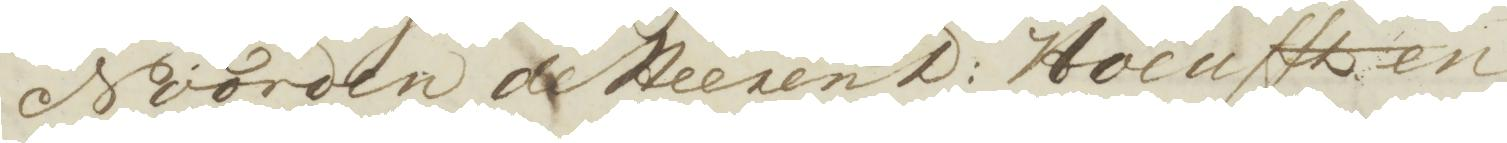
Noorden de Heeren D: Hoeufft en
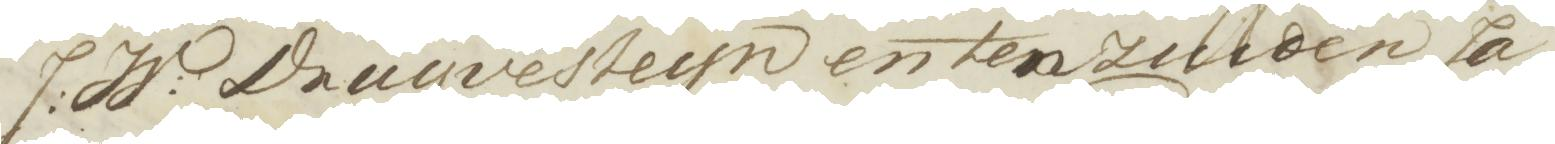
J:W: Druyvesteijn en ten zuiden Ja
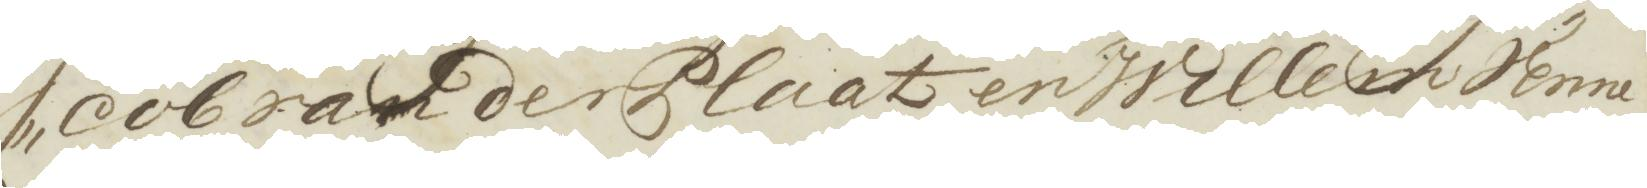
cob van der Plaat en Willem Venne
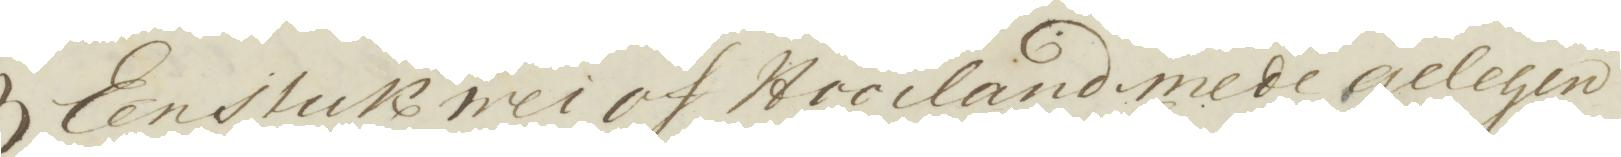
Een stuk wei of Hooiland mede gelegen
